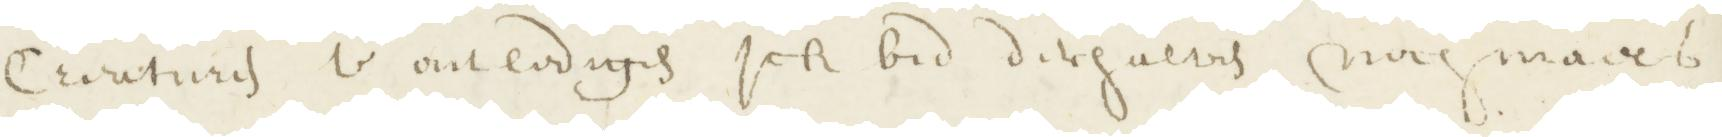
Creaturen te ontledigen jck bid derhalven nogmaels
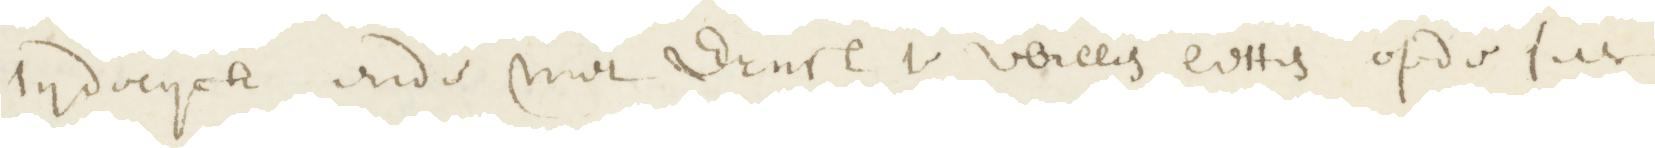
tydelyck ende met Ernst te willen letten opde seer
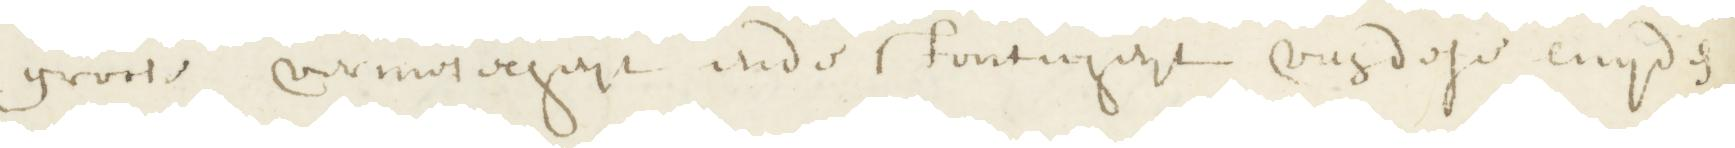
groote vermetelheyt ende stoutigeyt van dese luyden
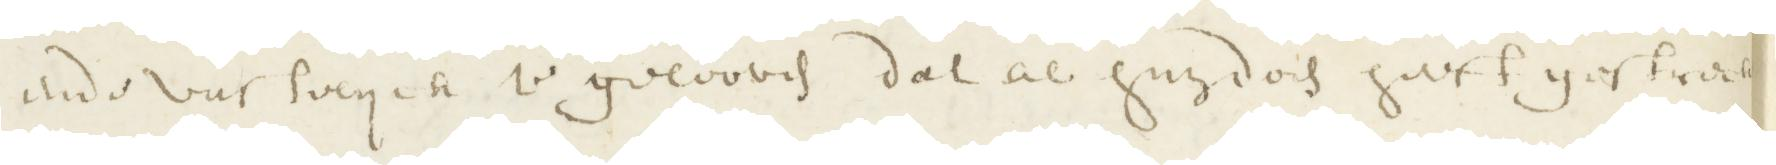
ende vastelyck te gelooven dat al hun doen heeft gestreck
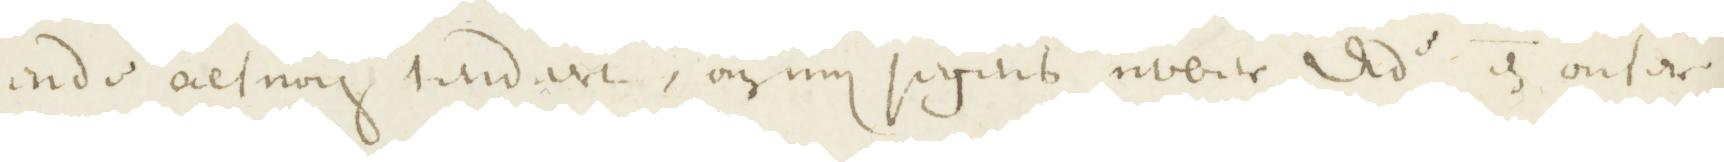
ende alsnog tendeert, om my jegens uwer Ede en onser
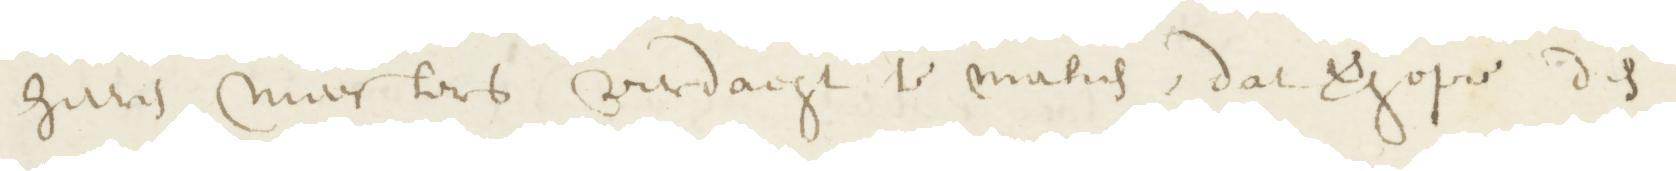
heeren meesters verdacht te maken, dat verhope den
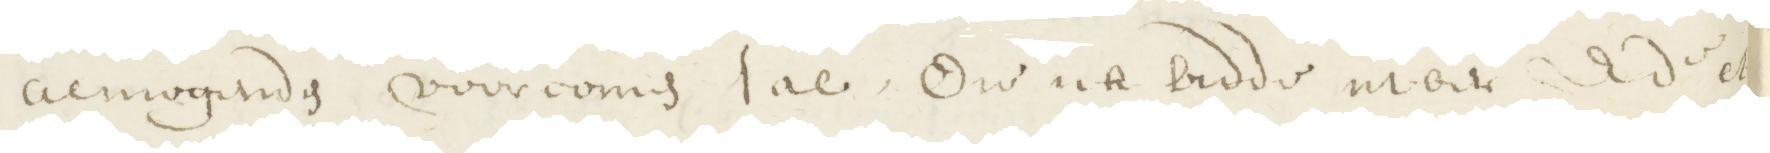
almogenden voorcomen sal, die ick bidde uwer Ede et
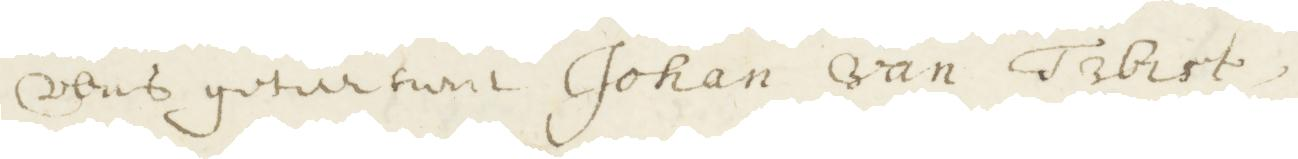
was geteeckent Johan van Twist,
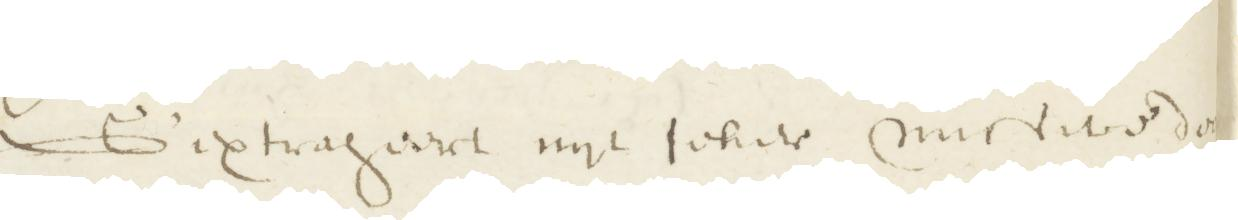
G' extraheert uyt seker missive de
